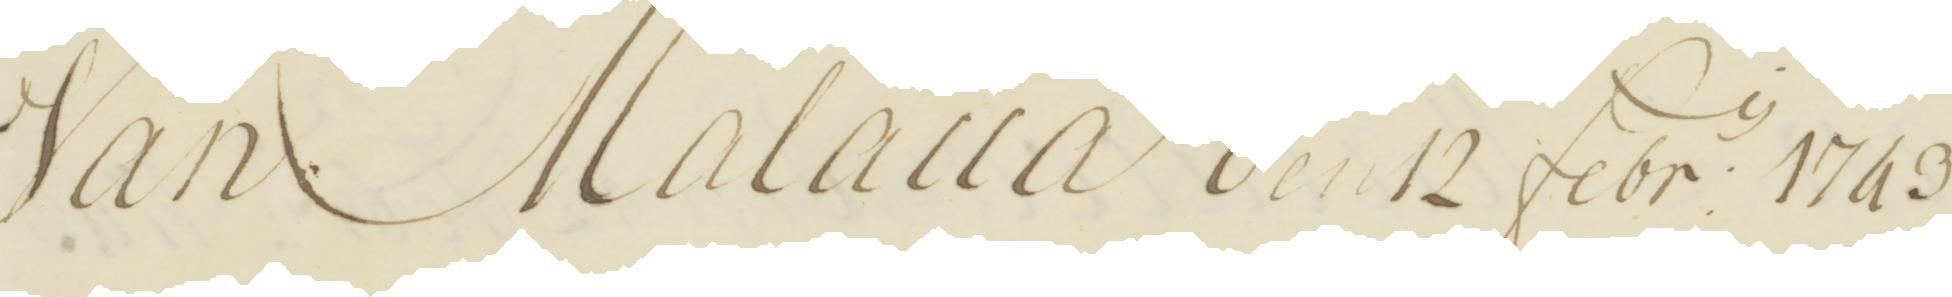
Van Malacca den 12 febr:ij 1743
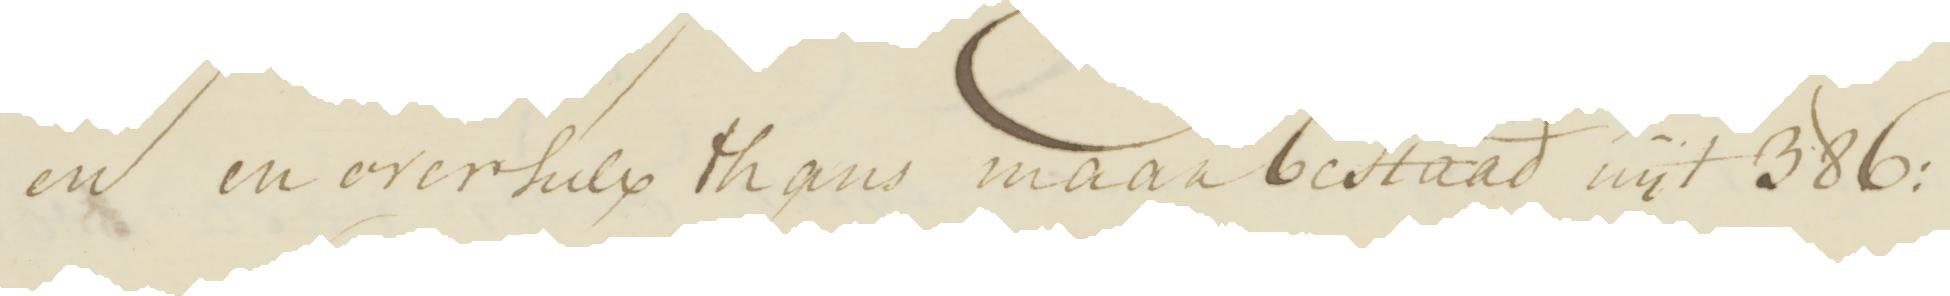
en en over sulx thans maar bestaad uijt 386:
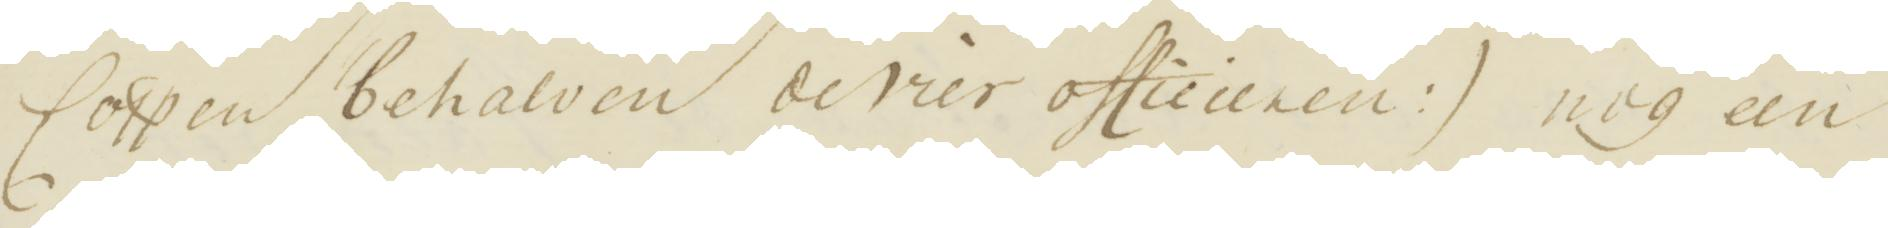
coppen (behalven de vier officieren:) nog een
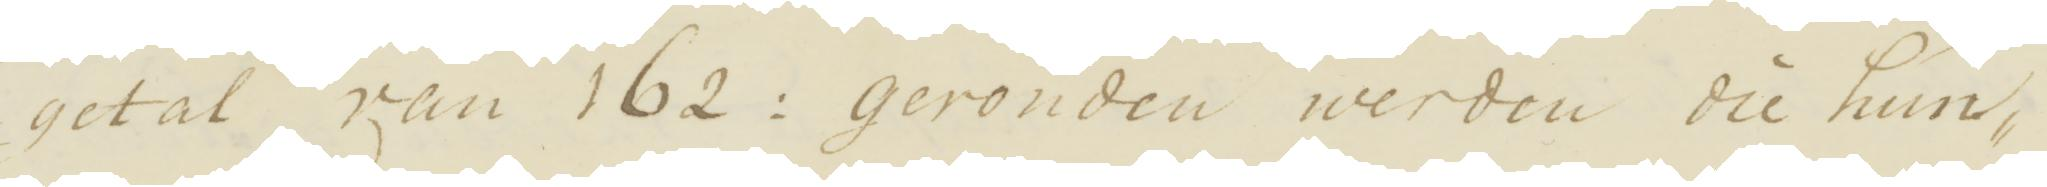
getal van 162: gevonden werden die hun„
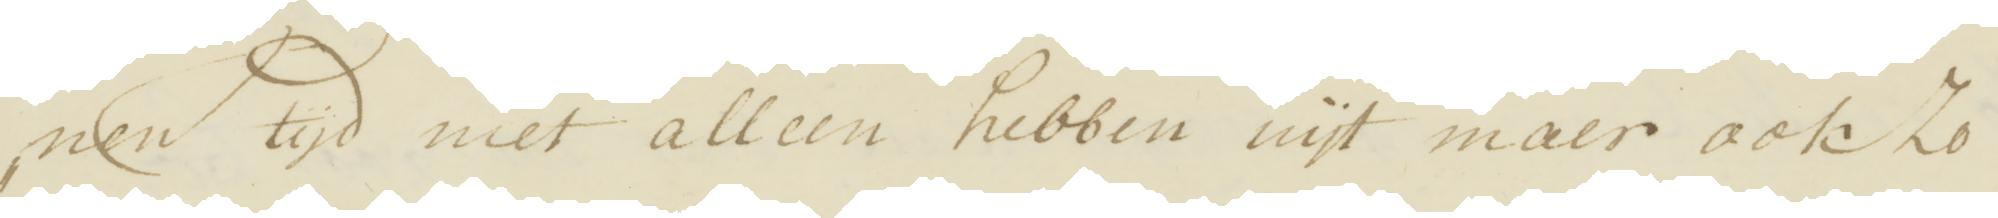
nen tijd niet alleen hebben uijt maer ook zo
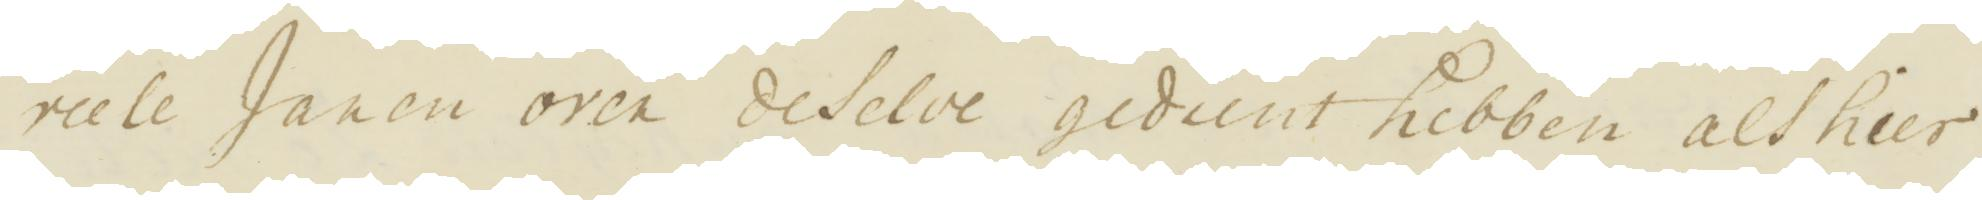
veele Jaren over deselve gedient hebben als hier
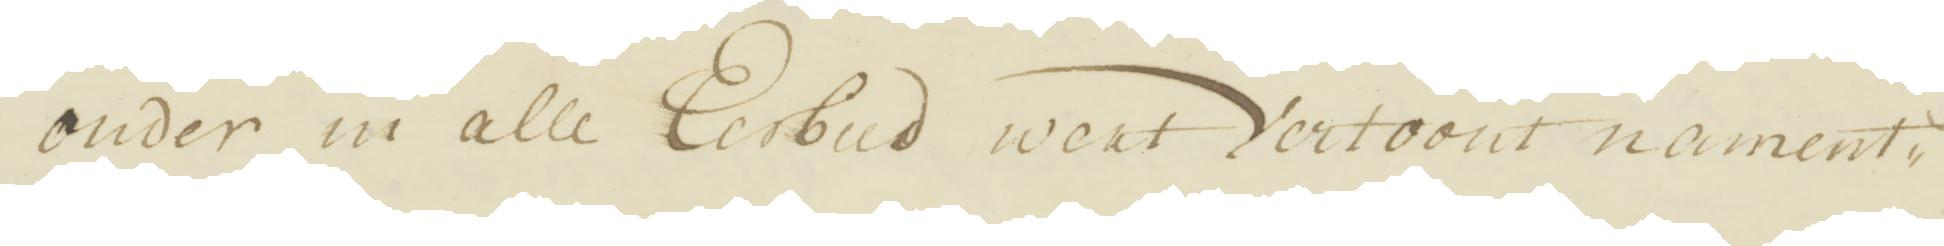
onder in alle Eerbied wert Vertoont nament„
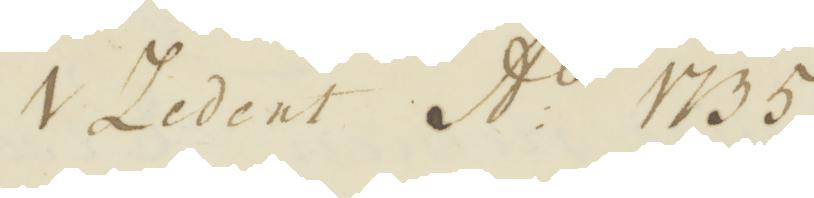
1 Zedert A:o 1735
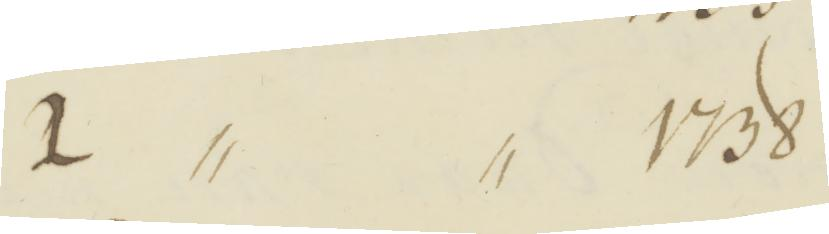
1 „ „ 1738
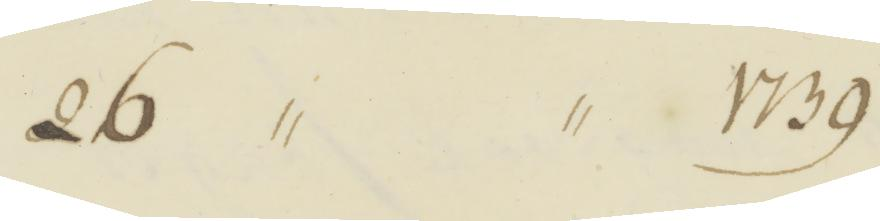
26 „ „ 1739
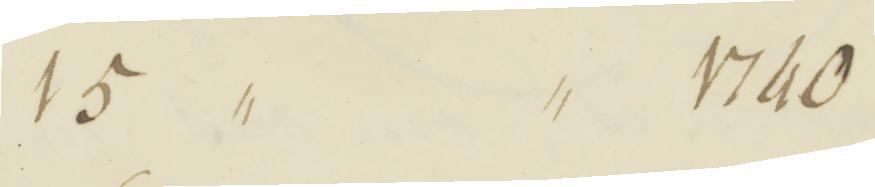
15 „ „ 1740
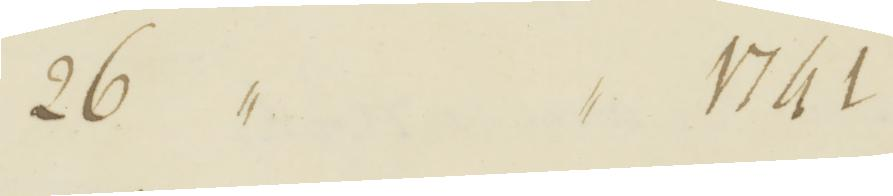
26 „ „ 1741
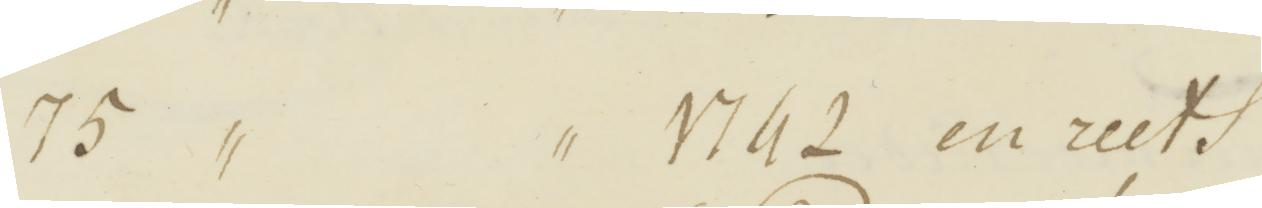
75 „ „ 1742 en reets
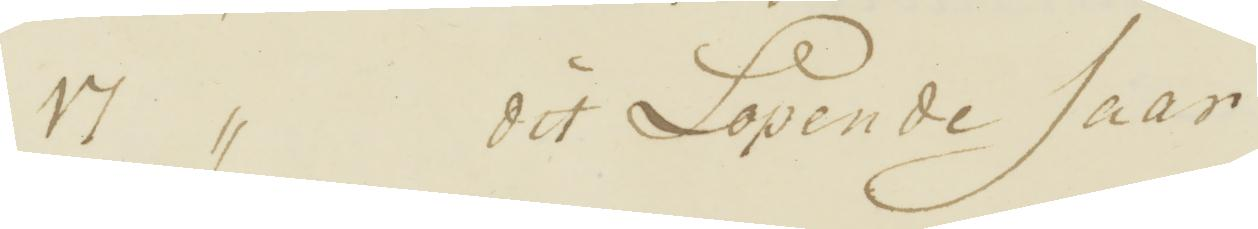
17 „ dit Lopende Jaar
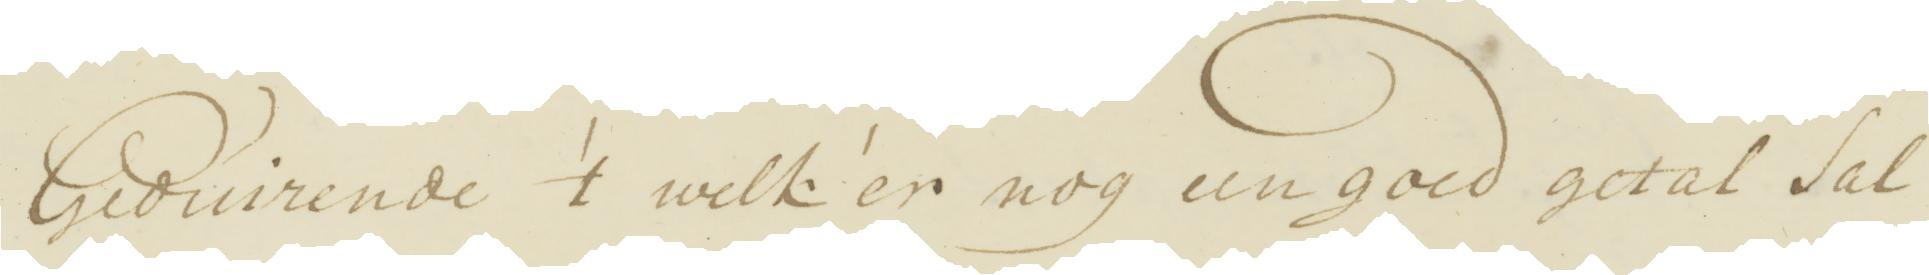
Geduirende ’t welk 'er nog een goed getal sal
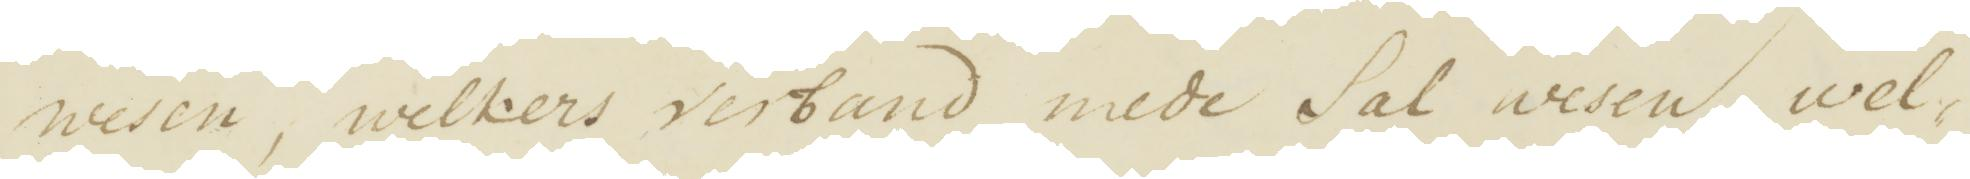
wesen, welkers verband mede sal wesen, wel„
